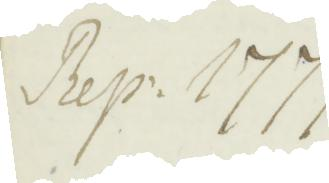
Rep: 1777
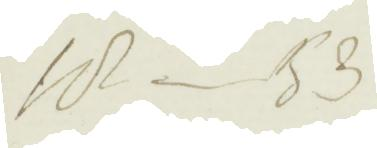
18 -12 53
